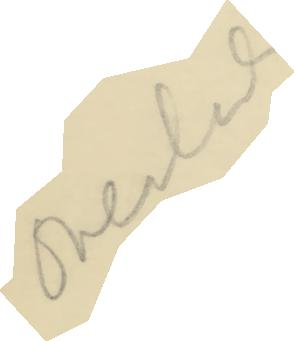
Overled
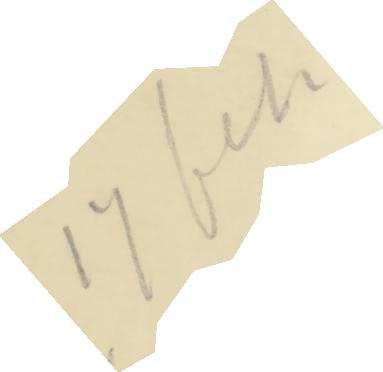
17 feb
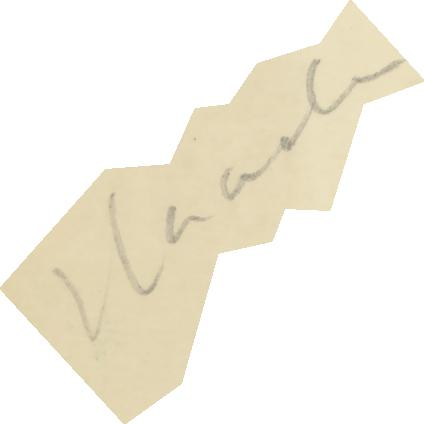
Haarl
